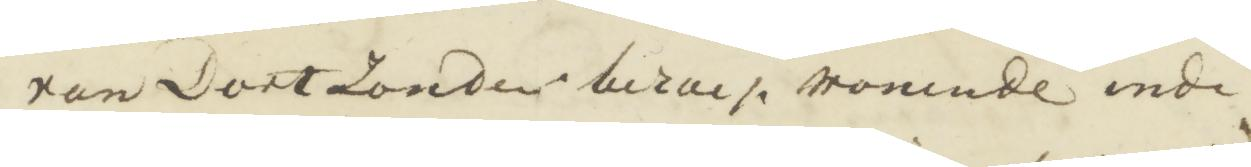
van Dort zonder beroep wonende inde
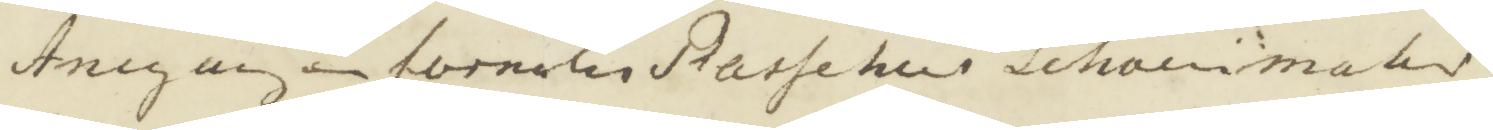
Anegang en Cornelis Passchier schoenmaker
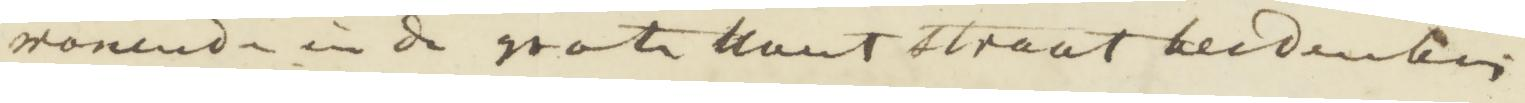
wonende in de grote Houtstraat beiden bin
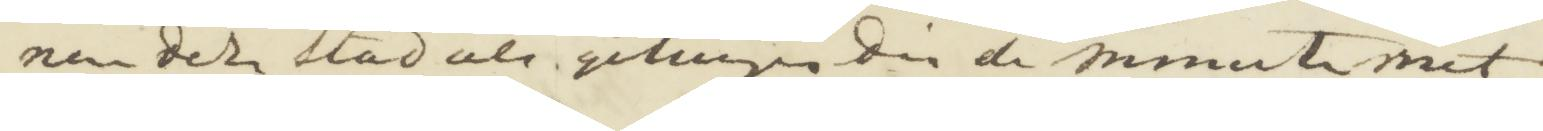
nen deze stad als getuigen die de minute met
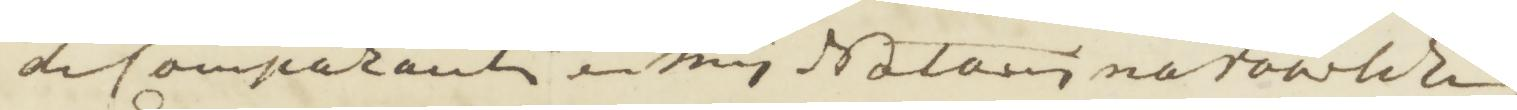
de Comparant en mij Notaris na voorlezen
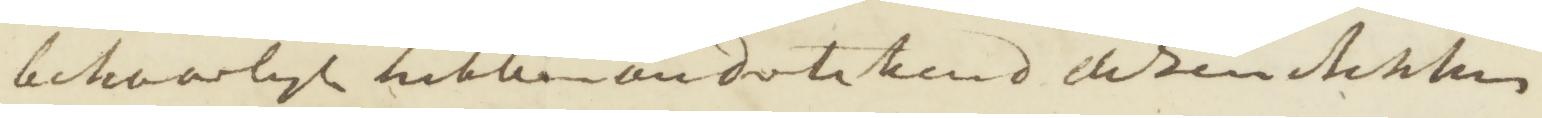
behoorlyk hebben ondertekend dezen Achtien
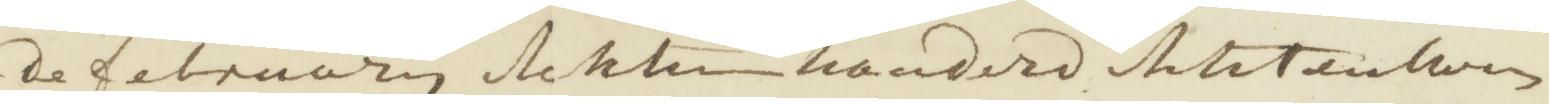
de februarij Achten honderd Acht en twin
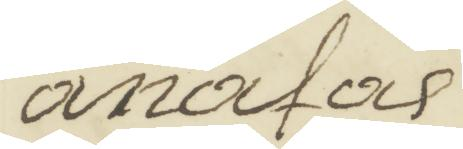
anafas
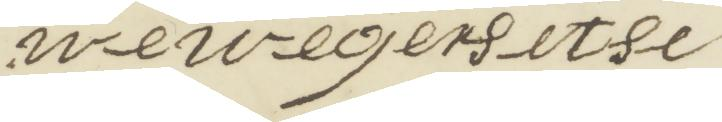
wewegersetse
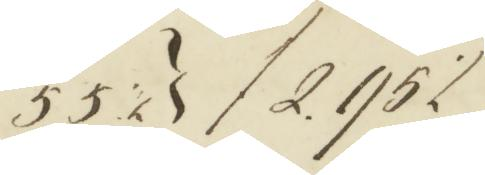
55.½ } ƒ2. 95½
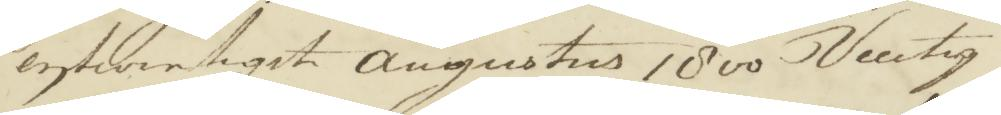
en twintigste augustus 1800 Veertig
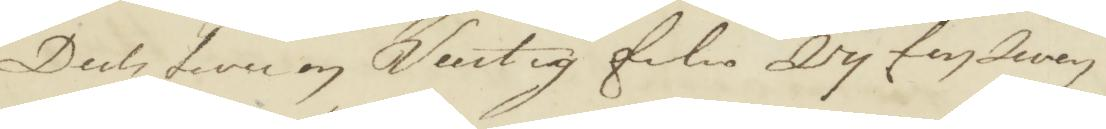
Deel twee en Veertig folio Vyf en zeven
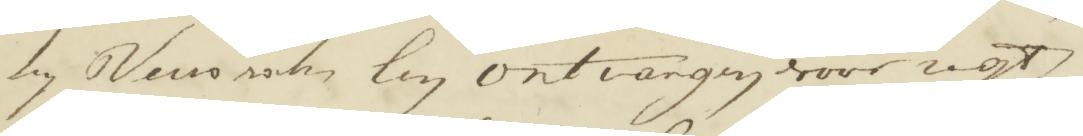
tig Verso vak Een ontvangen voor regt
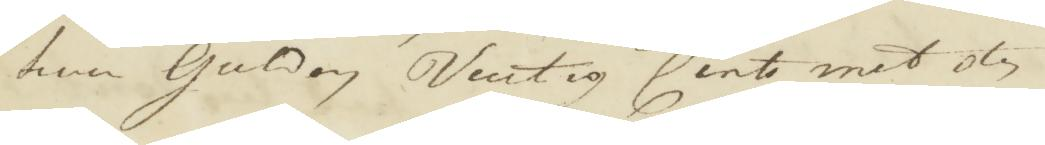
twee Gulden Veertig Cents met den
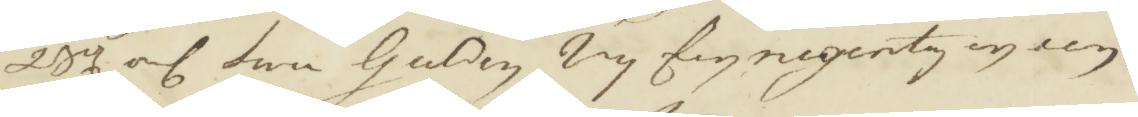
23% onC twee Gulden Vyfen negentig en een
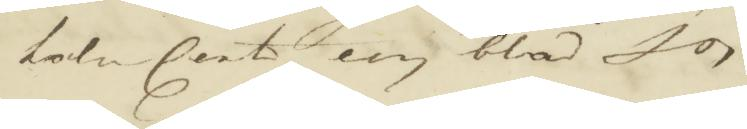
halve Cent een blad Io
